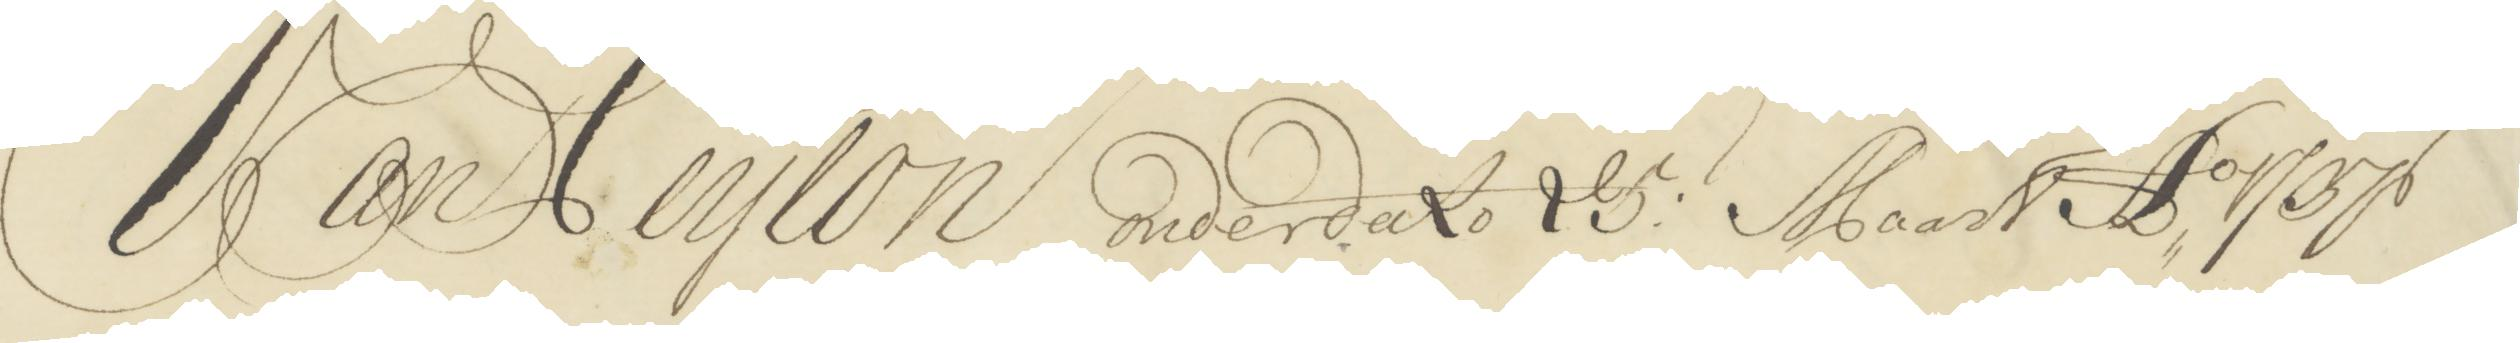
Van Ceijlon onderdato 25:' Maart A:o 1737
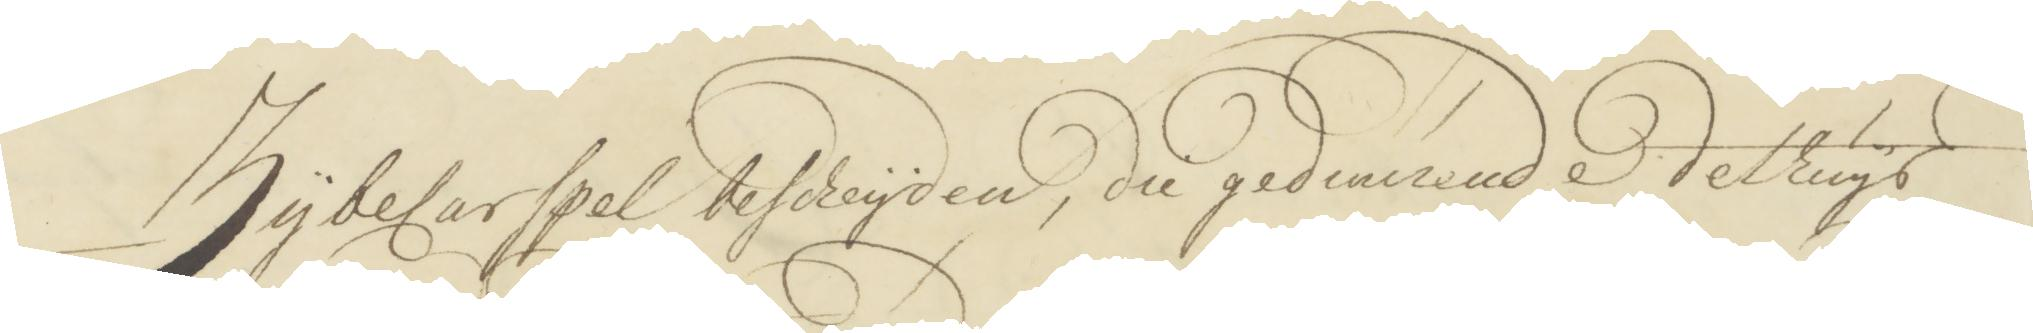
Zij becarspel bescheijden, die geduurende dethuijs
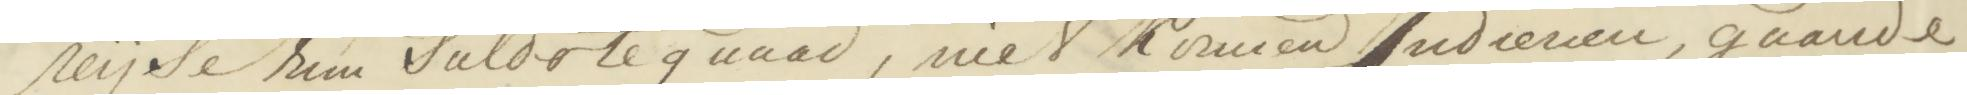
reijse hun Saldotequaad, niet Konnen Jndienen, gaande
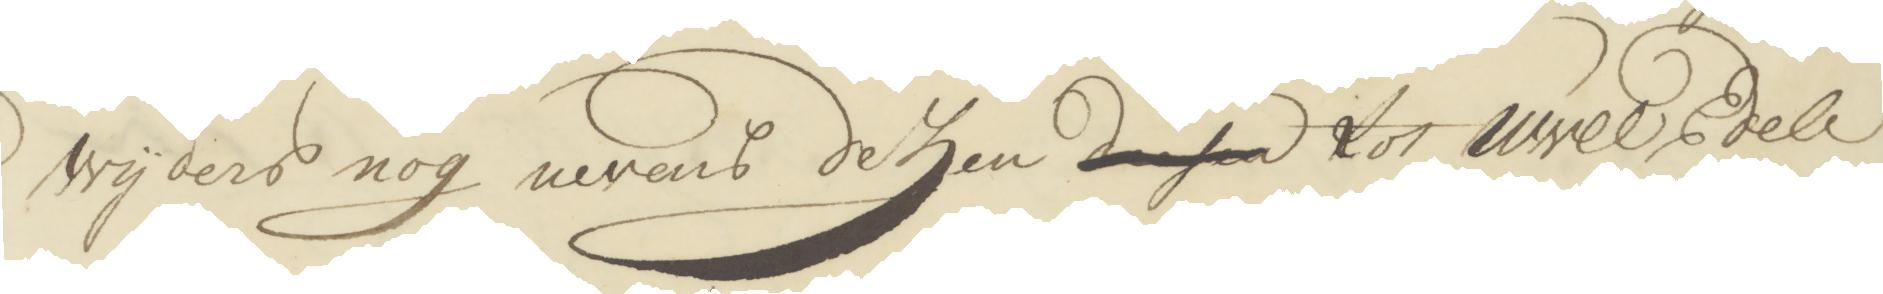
wijders nog nevens dezen deesen tot uwel Edele
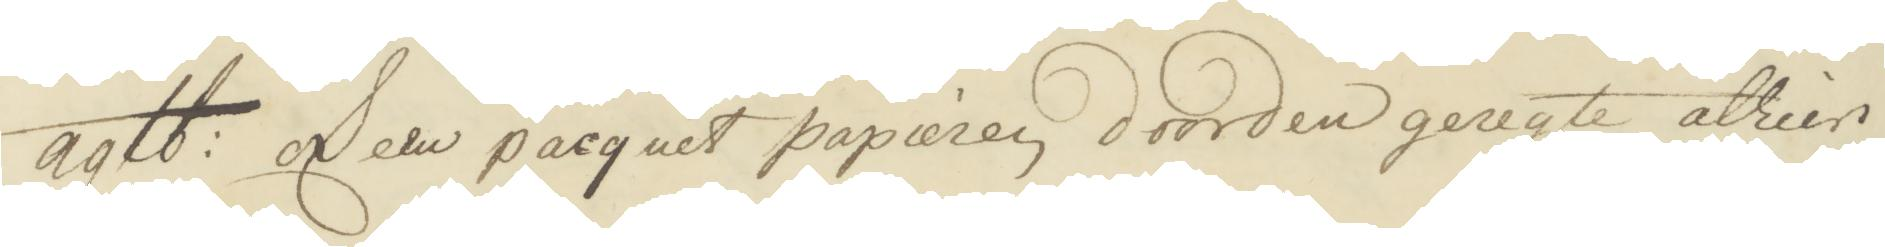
agtb: over een pacquet papieren doorden geregte alhier,
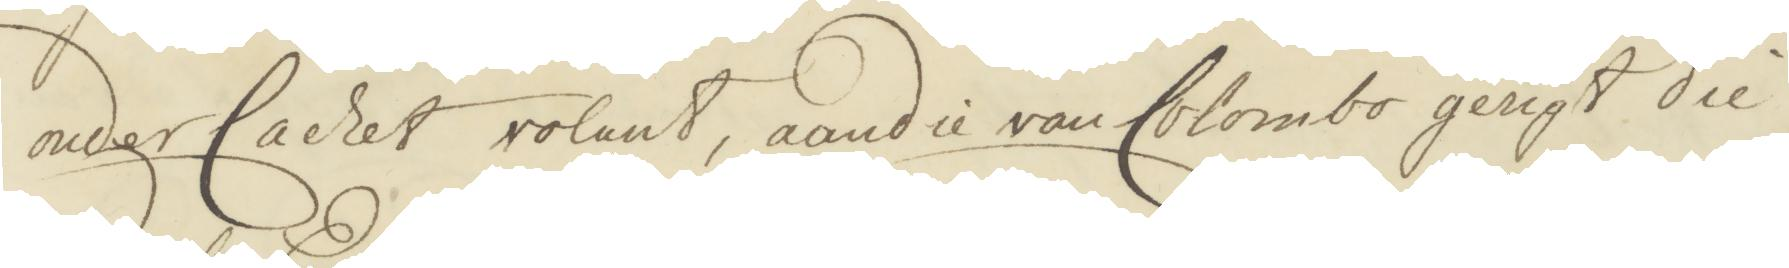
onder Cachet volant, aandie van Colombo gerigt die
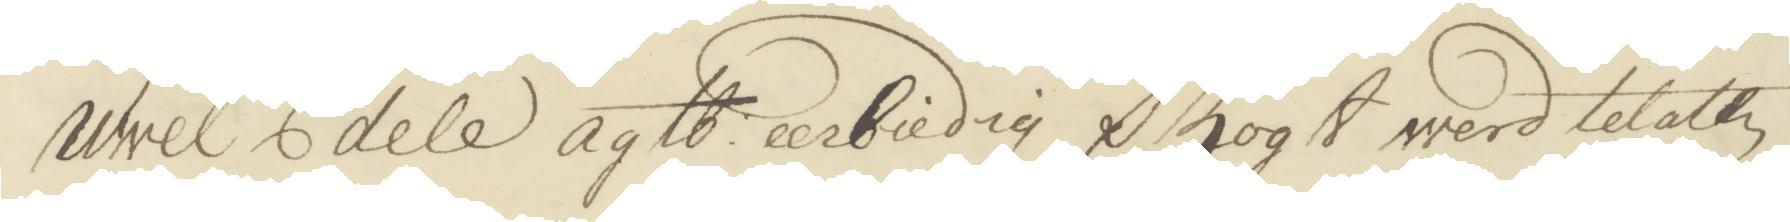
Uwel Edele agtb: eerbiedig verzogt werd telaten
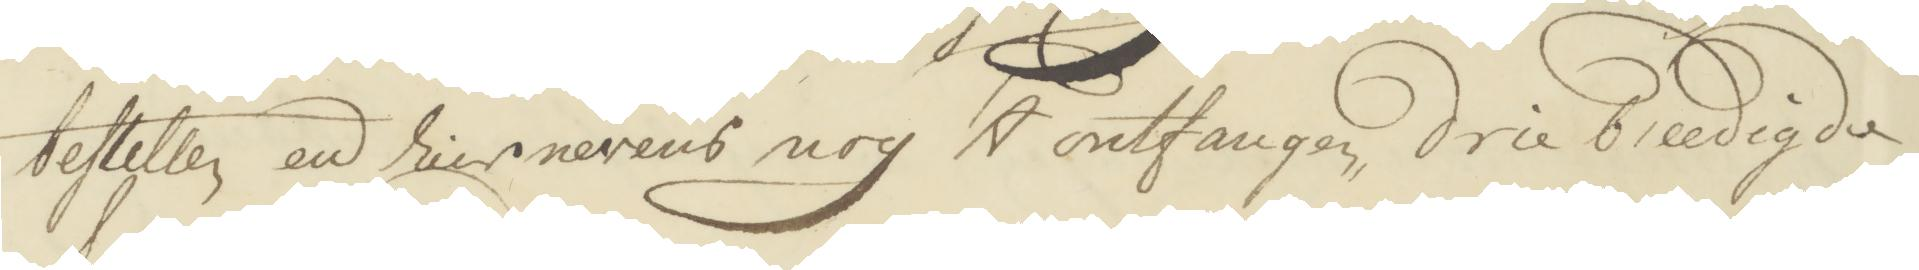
testellen en hier nevens nog 't ontfangen, drie beedigde
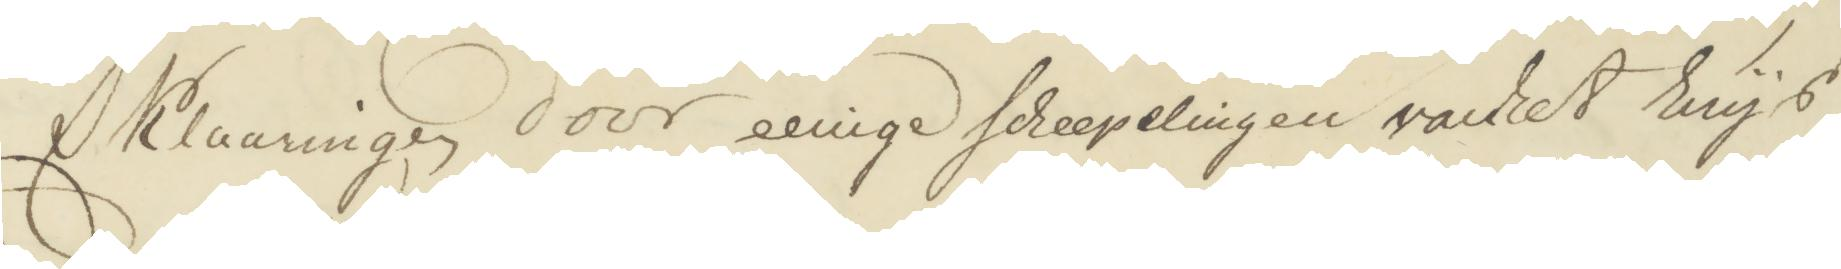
verklaaringen door eenige scheepelingen vanhet huijs
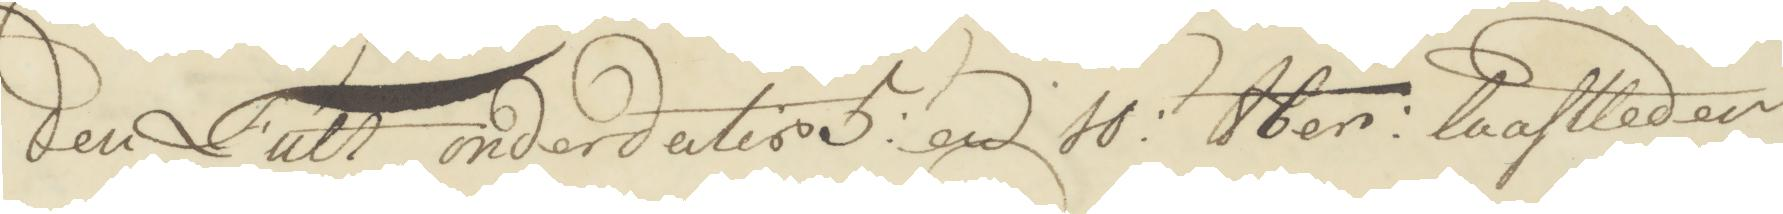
den Fult onderdatis 5: en 10:' 8ber: laastleden
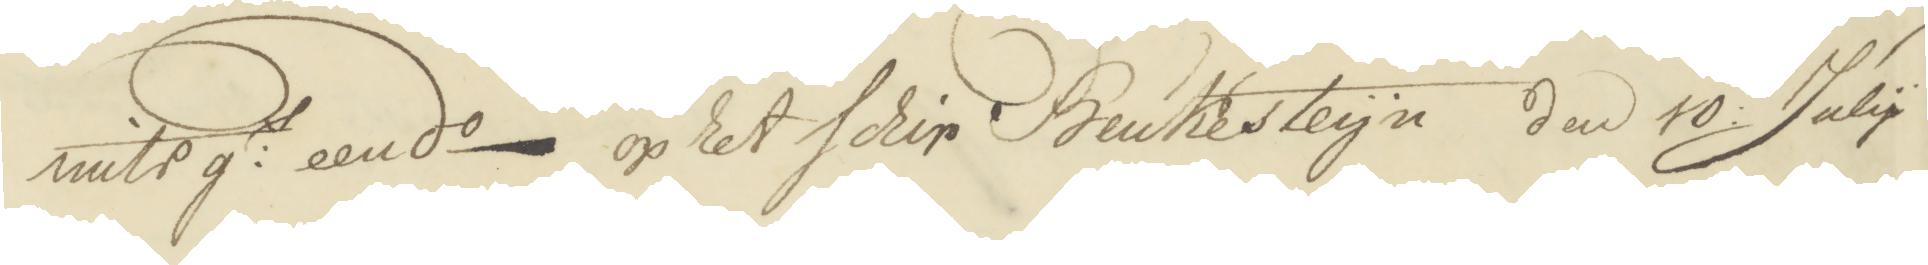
mitsg:s een d-o op het schip Beukesteijn den 10:' Julij
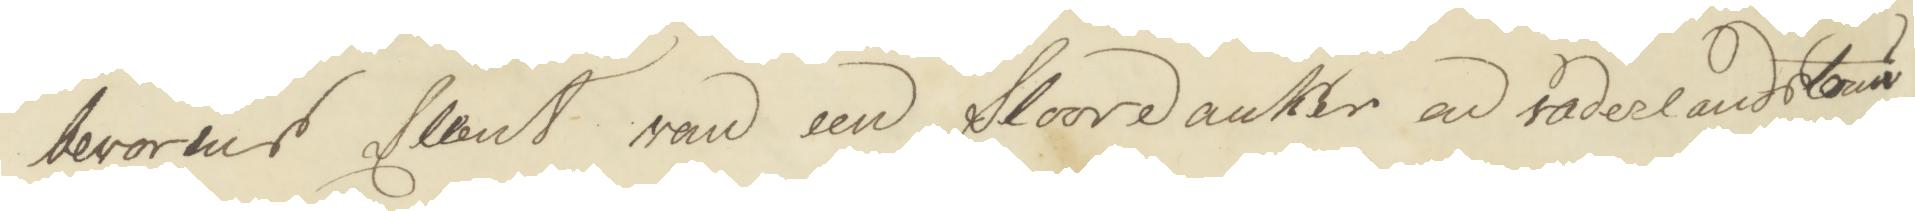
bevorens verleent van een verloore anker en vaderlands touw
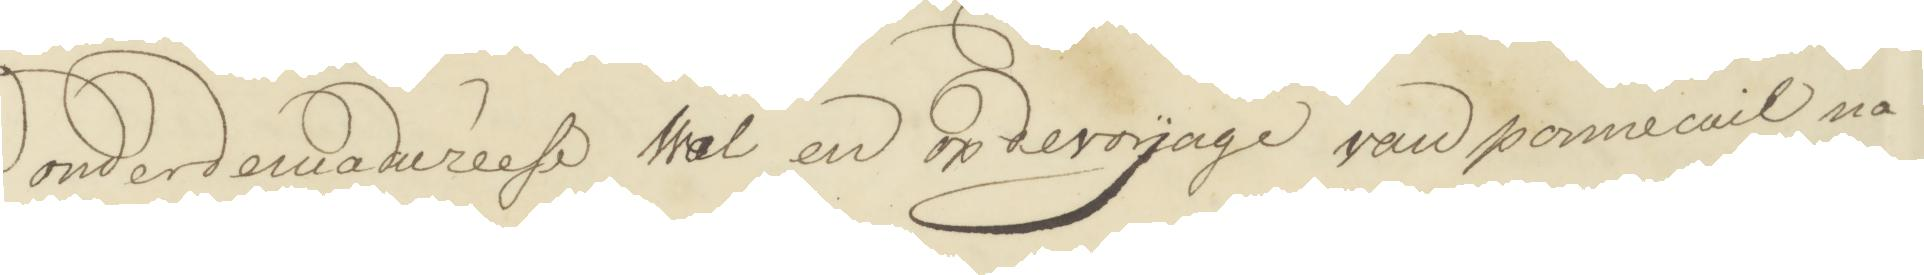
onderdemadureese Wal en op devoijage van ponnecail na
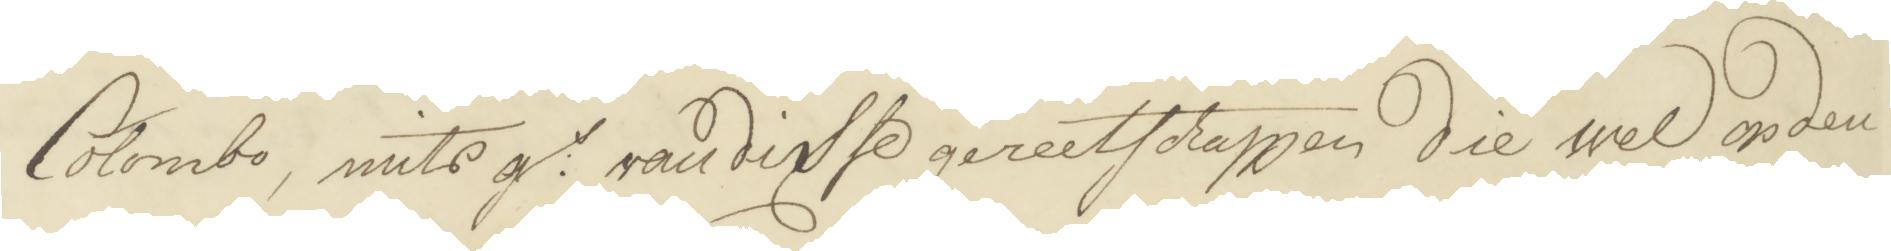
Colombo, mitsg:s van diverse gereetschappen die wel op den
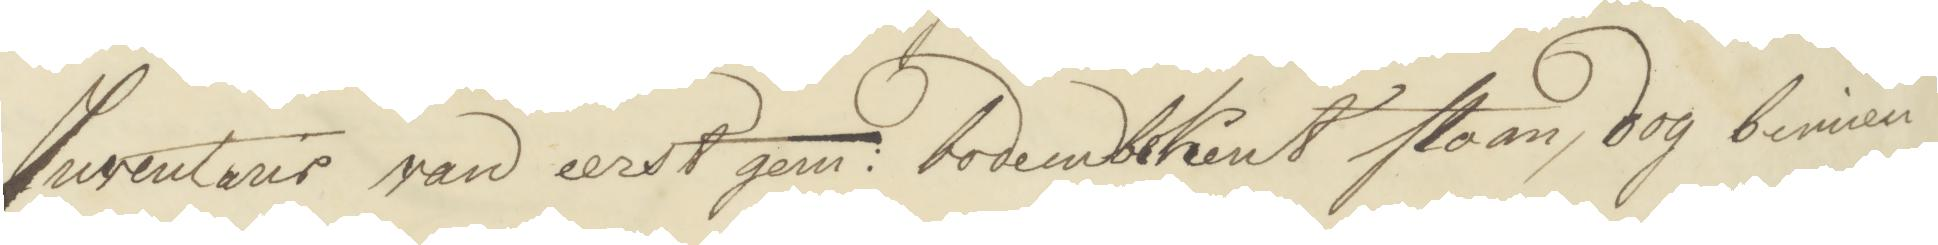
Jnventaris van eerst gem: bodembekent staan, dog binnen
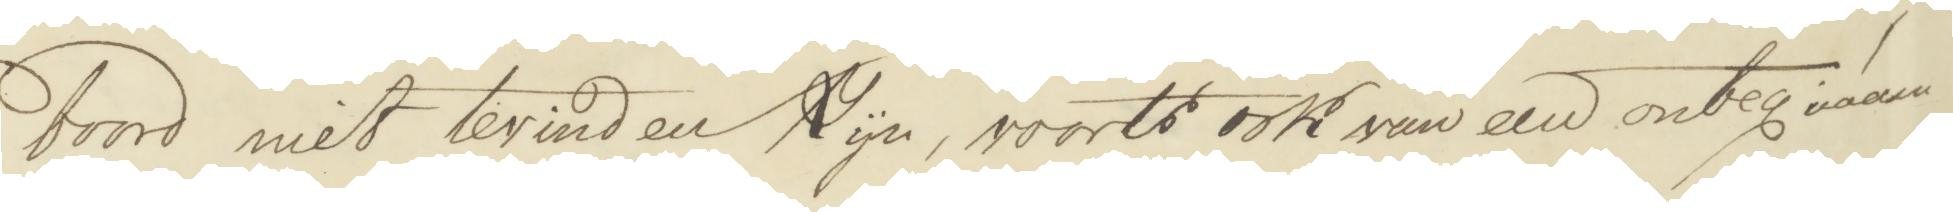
boord niet tevinden zijn, voorts ook van een onbequaam
